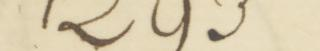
1293
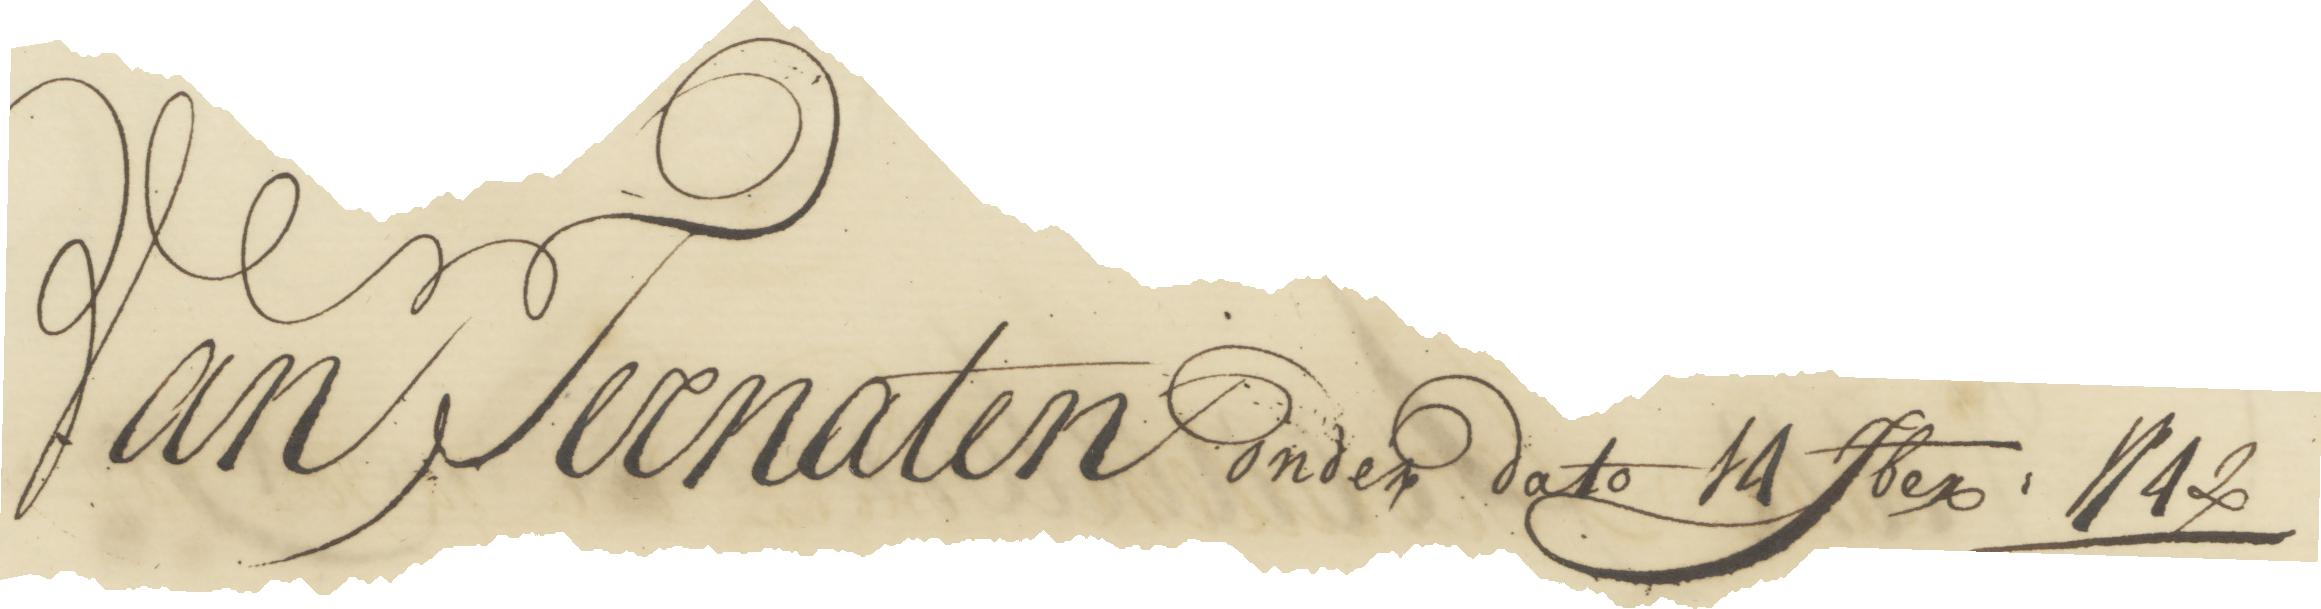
Van Ternaten onder dato 14 7ber: 1742
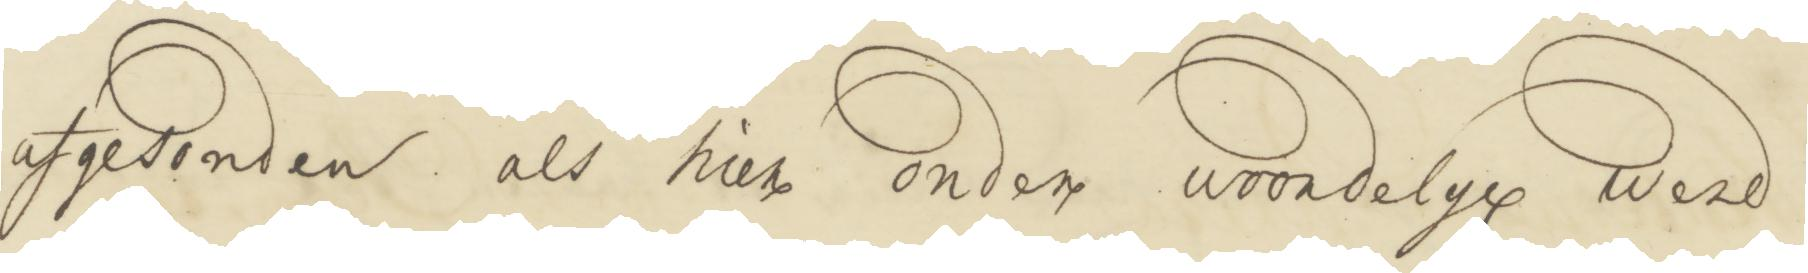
afgesonden als hier onder woordelyx werd
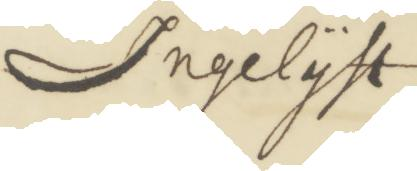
Ingelijst
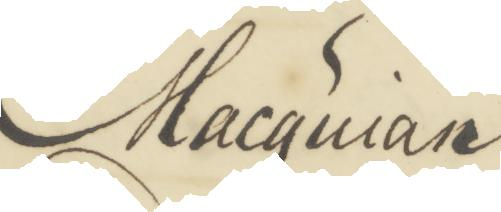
Macquian
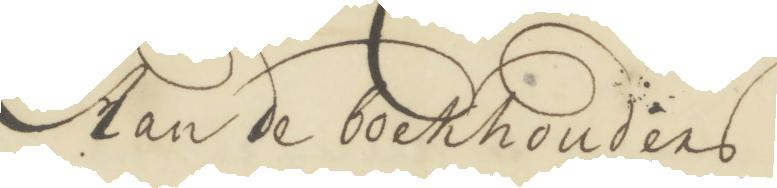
Aan de boekhouders
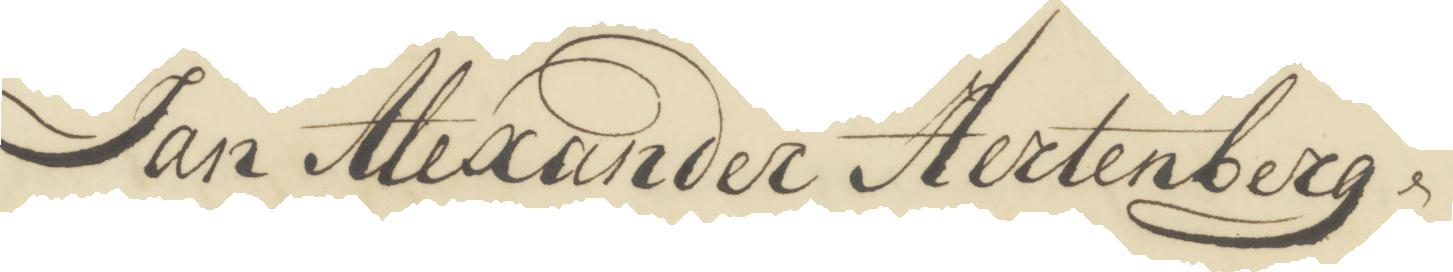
Ian Alexander Aertenberg en
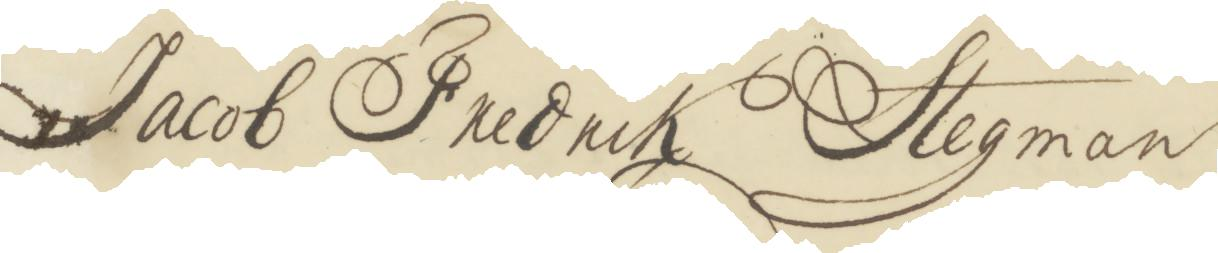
Iacob Fredrik Stegman
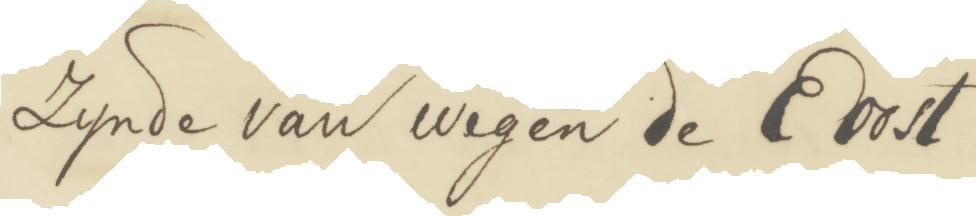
zynde van wegen de E oost
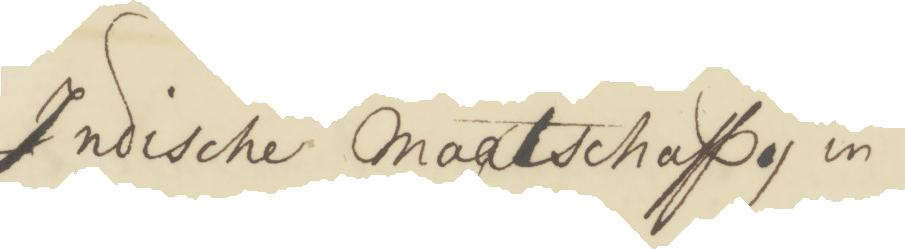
Indische maatschappij in
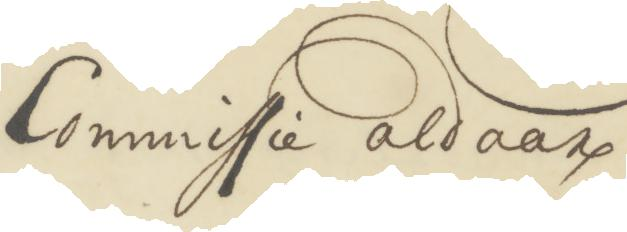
Commissie aldaar
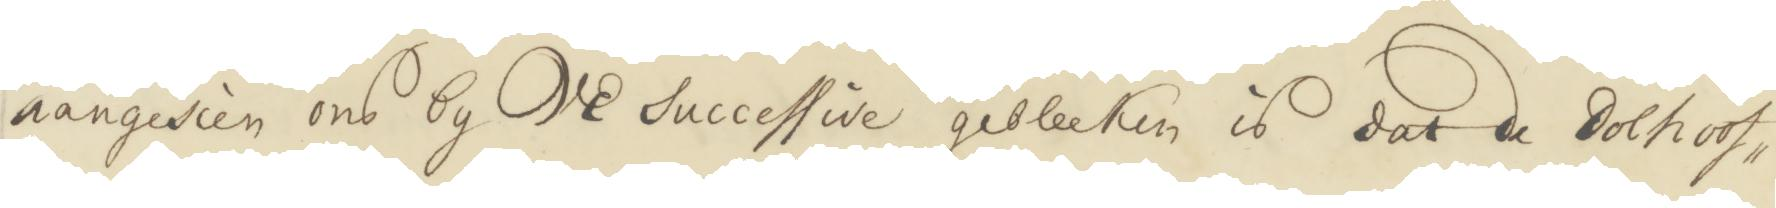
aangesien ons by VE successive gebleeken is dat de dolhoof„
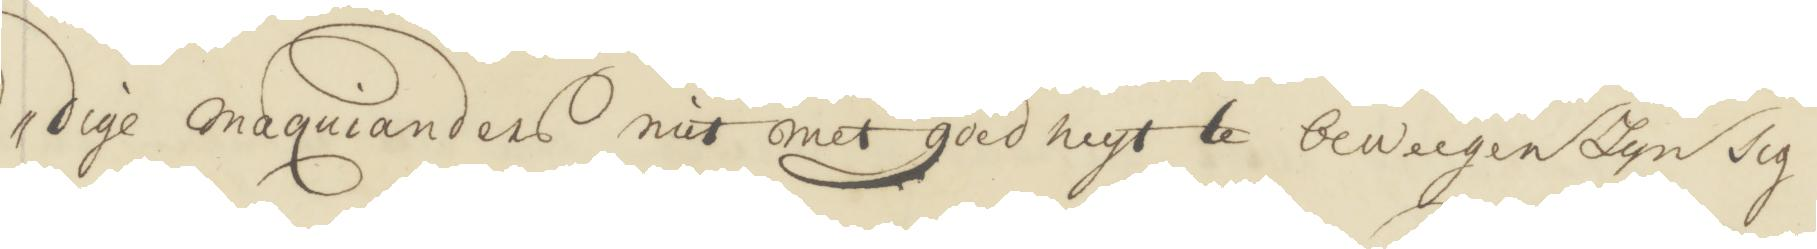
„dige maquianders niet met goedheyt te beweegen zyn sig
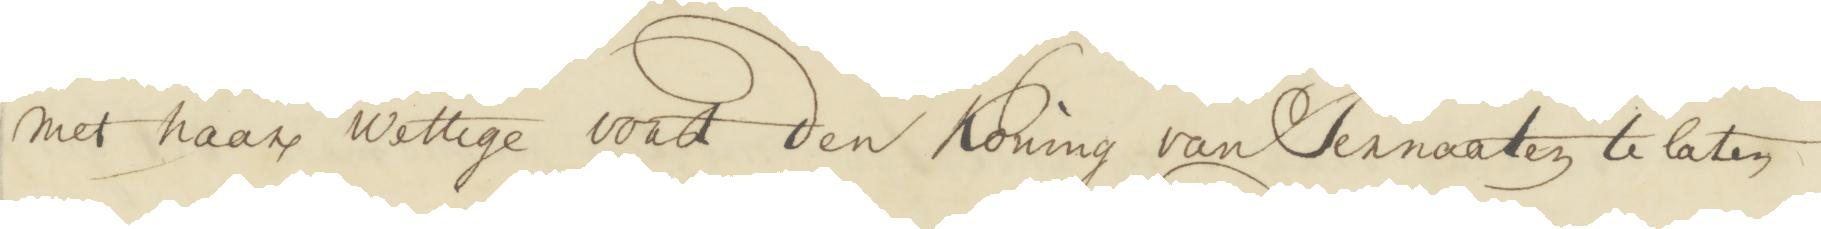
met haar wettige vorst den Koning van Ternaaten te laten
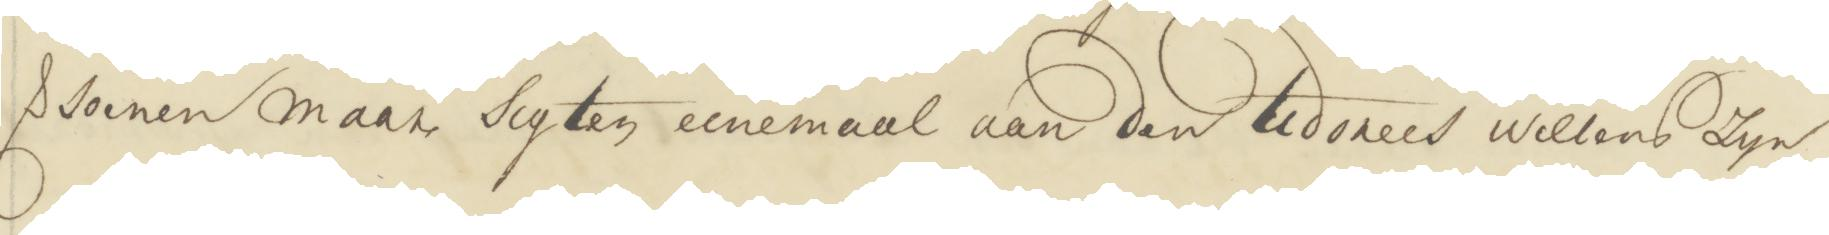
versoenen maar sig ten eenemaal aan den tidorees willens zyn
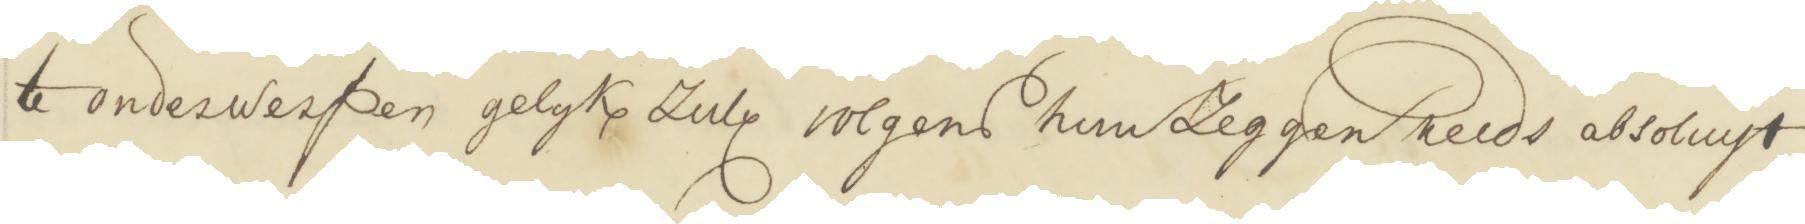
te onderwerpen gelyk zulx volgens hun zeggen reeds absoluyt
